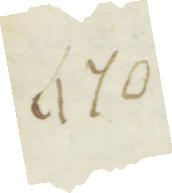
470
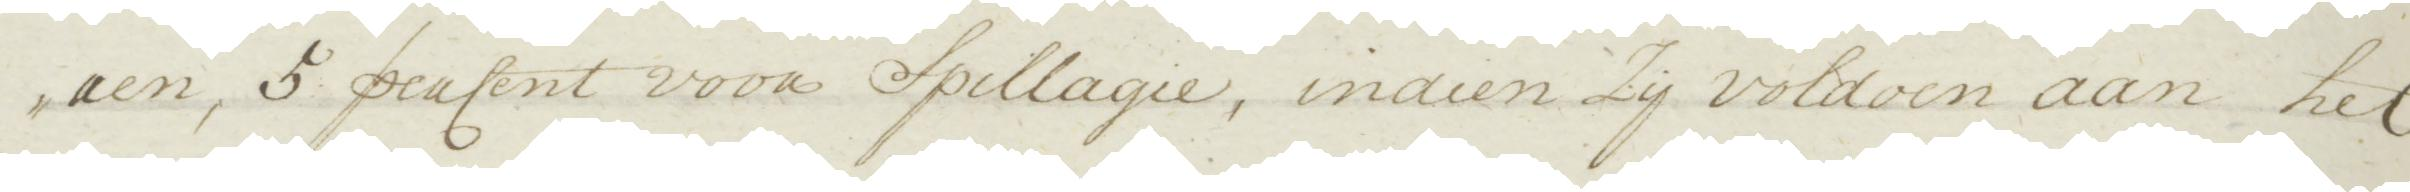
„ren, 5: percent voor spillagie, indien zij voldoen aan het
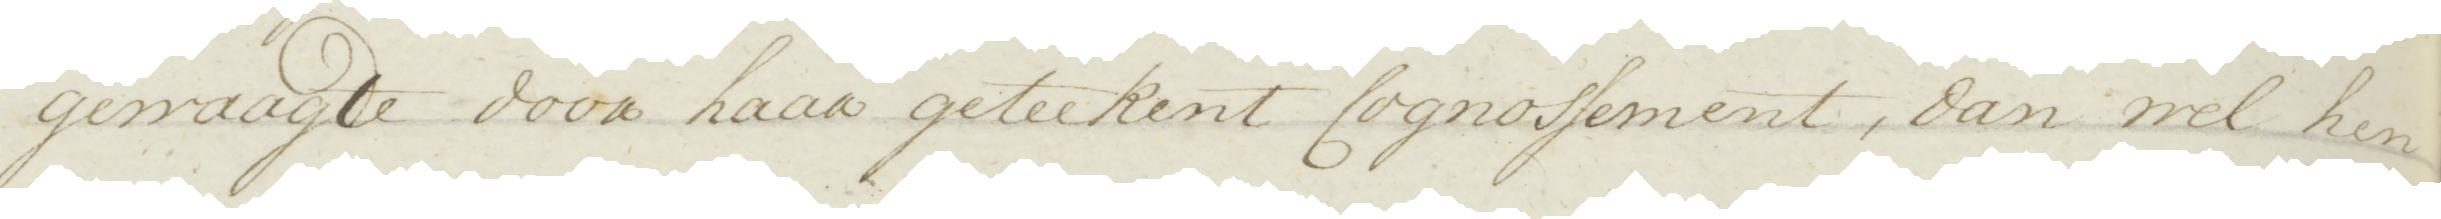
gewaagte door haar geteekent Cognossement, dan wel hen
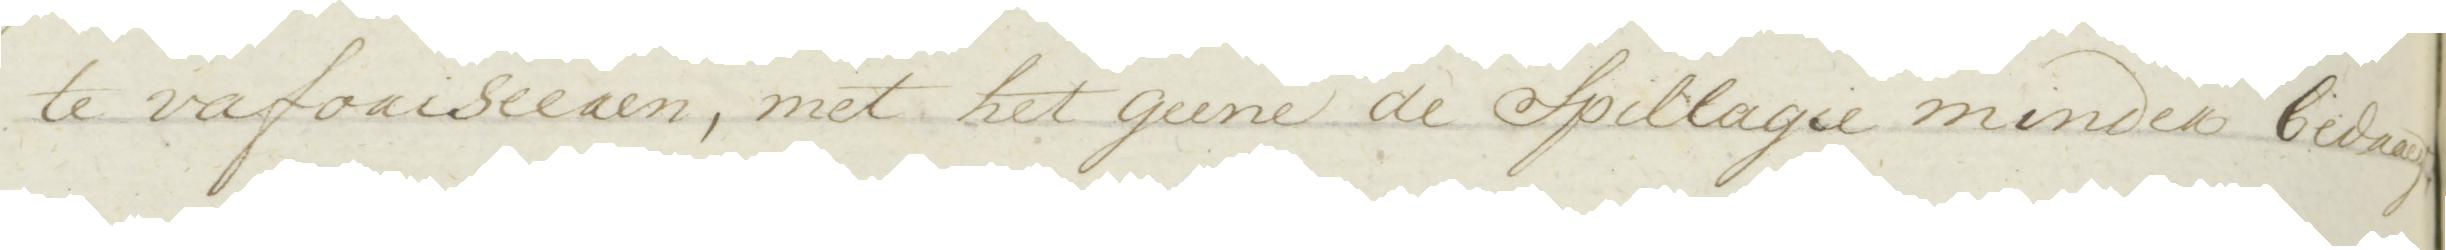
te vaforiseeren, met het geene de spillagie minder bedraagt
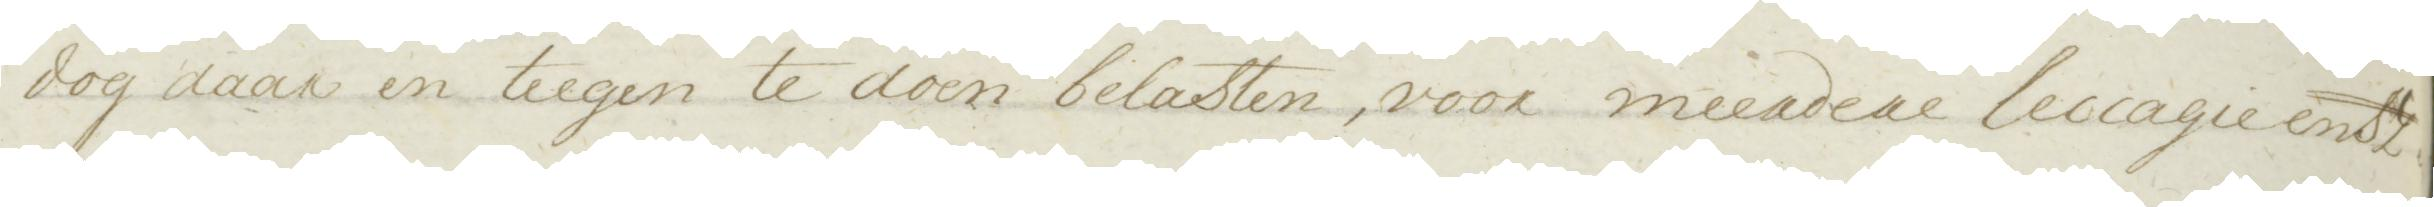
dog daar en teegen te doen belasten, voor meerdere leccagie ensz
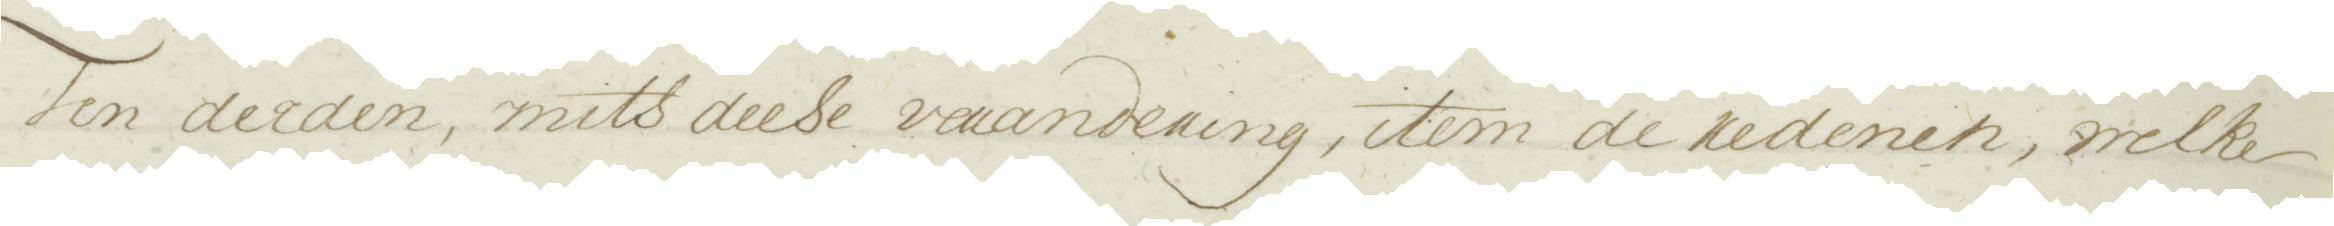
Ten derden, mits deese verandering, item de redenen, welke
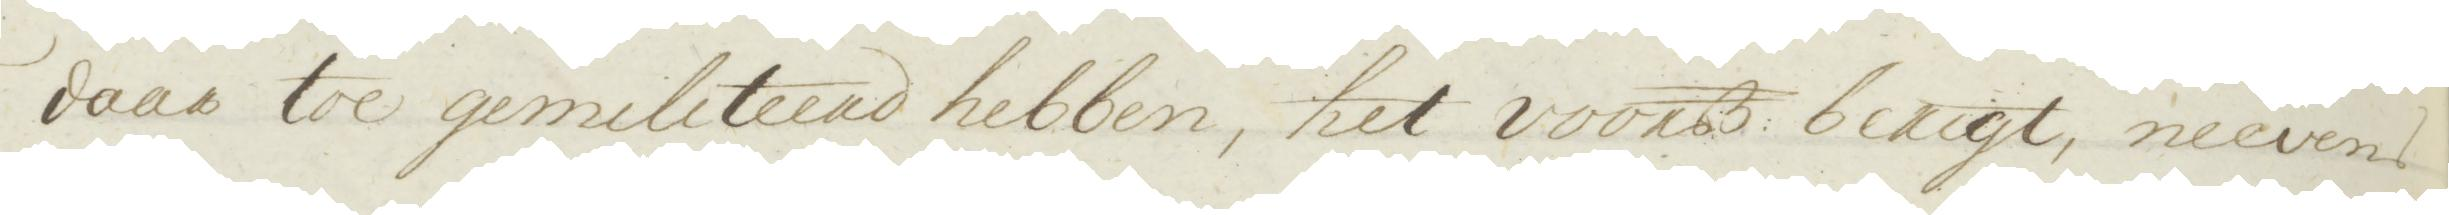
daar toe gemiliteerd hebben, het voorsz: berigt, neevens
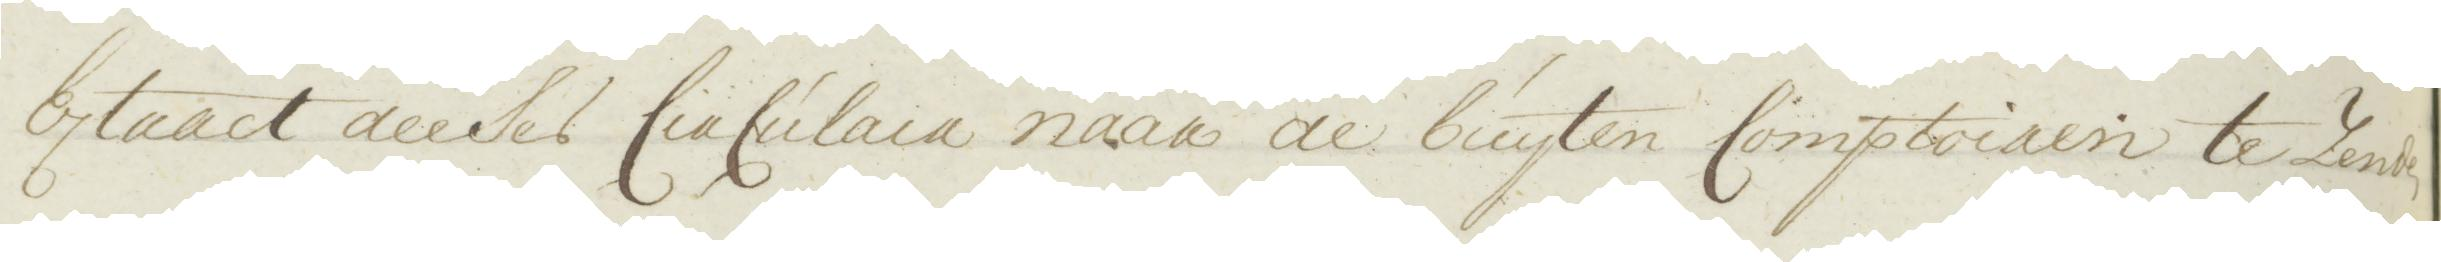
Extract deeses Circulair naar de buijten Comptoiren te zenden
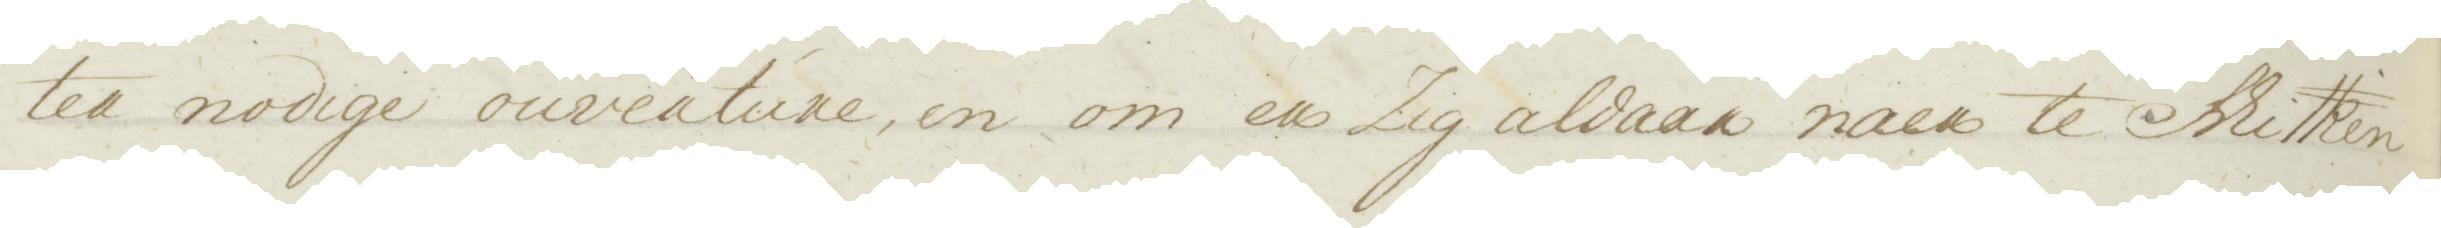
ter nodige ouverture, en om er zig aldaar naer te schikken
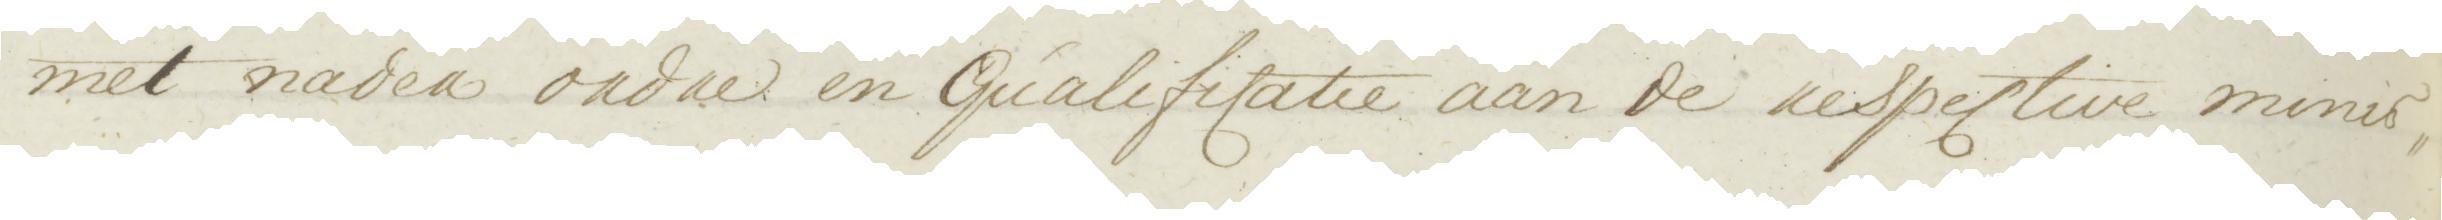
met nader ordre en qualificatie aan de respective minis
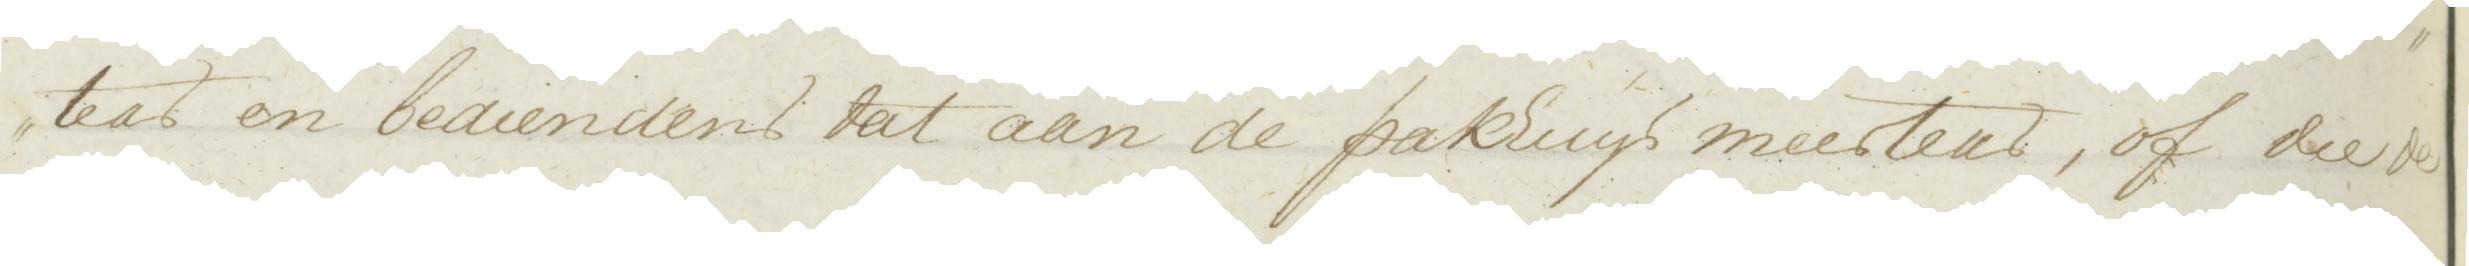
„ters en bediendens dat aan de pakhuijs meesters, of die de
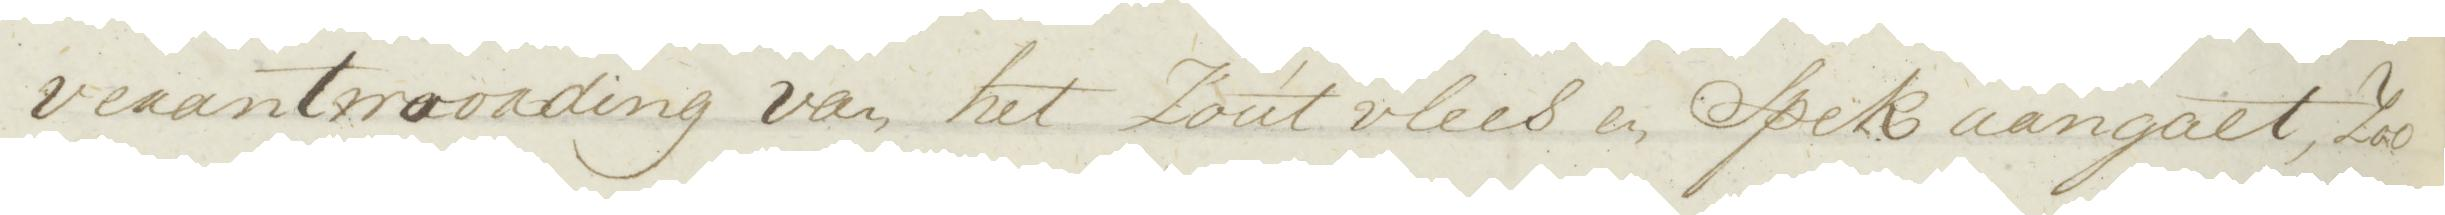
verantwoording van het zout vlees en spek aangaet, zoo
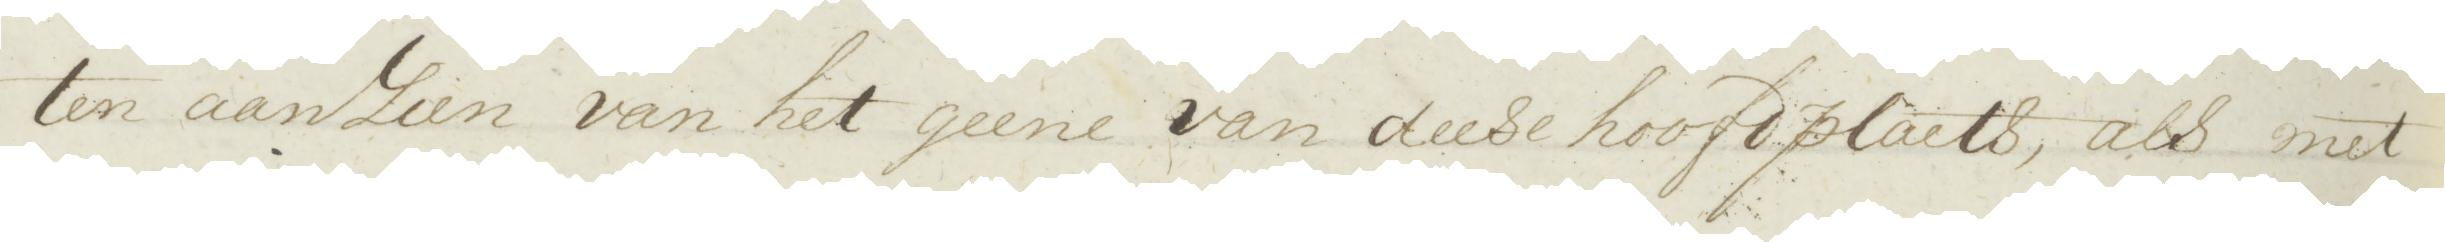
ten aanzien van het geene van deese hoofdplaets, als met
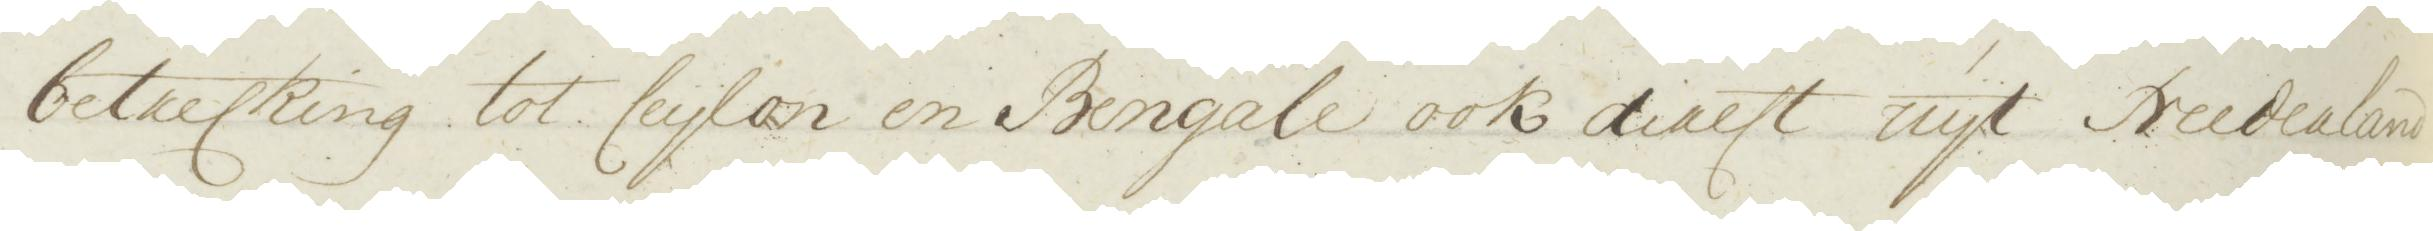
betrecking tot Ceijlon en Bengale ook direct uijt Neederland
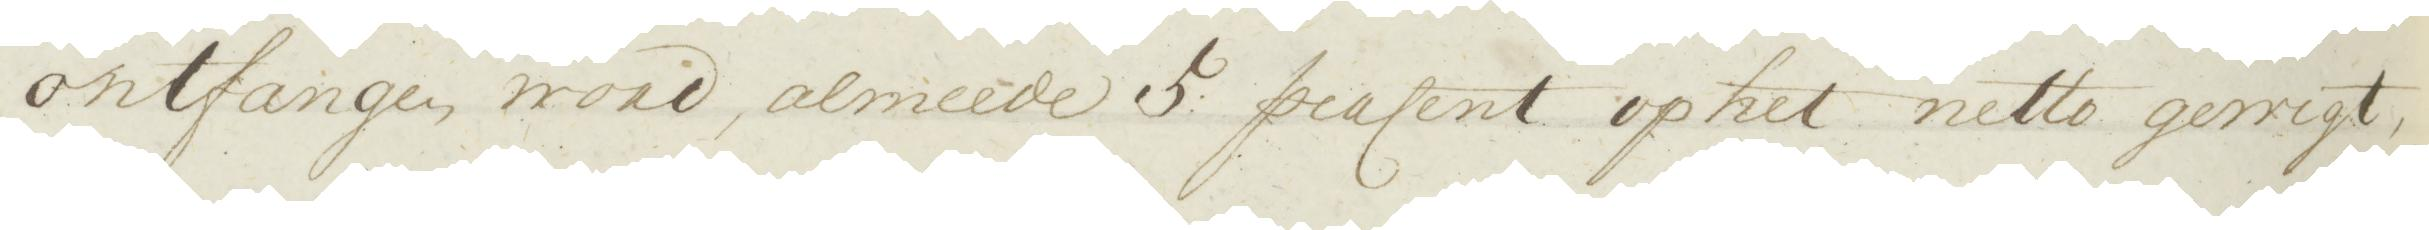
ontfangen word, almeede 5: percent op het netto gewigt,
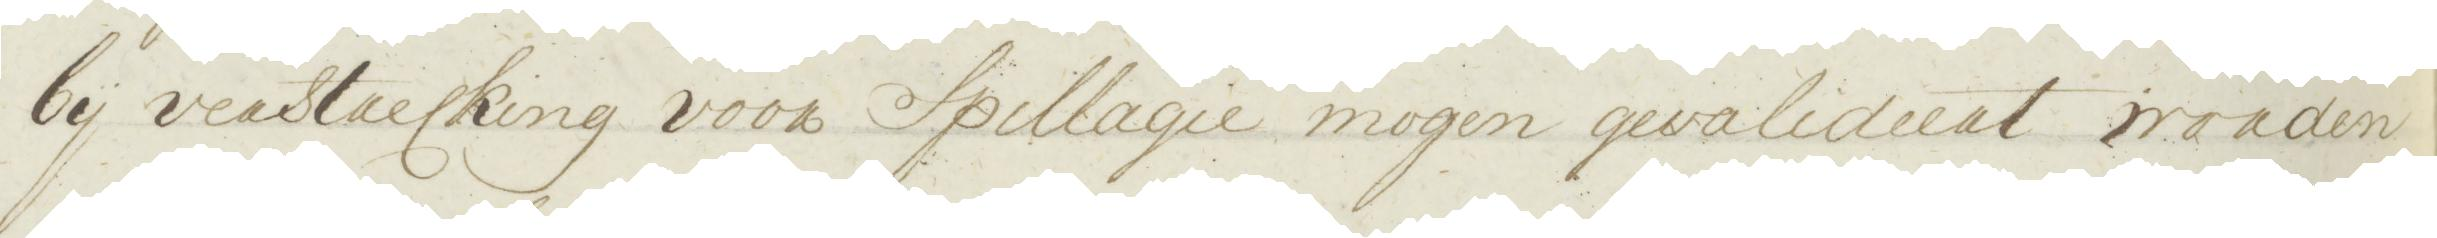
bij verstrecking voor spillagie mogen gevalideert worden
